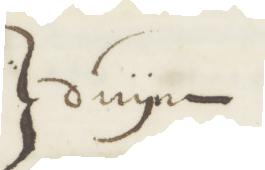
duijm
